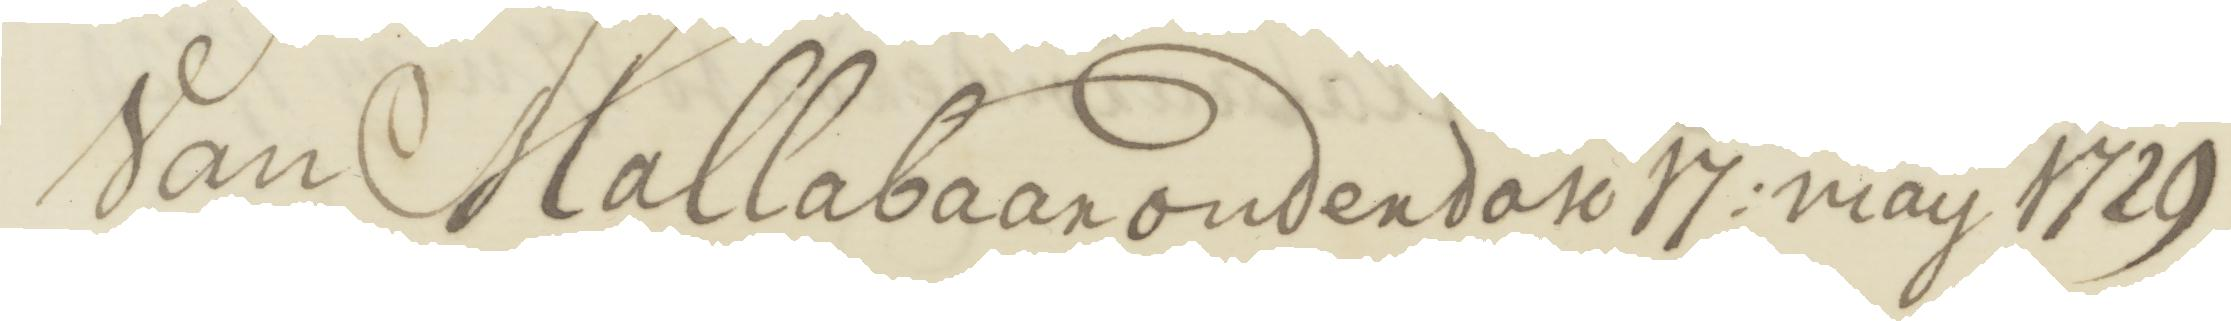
Van Mallabaar onder dato 17: maij 1729
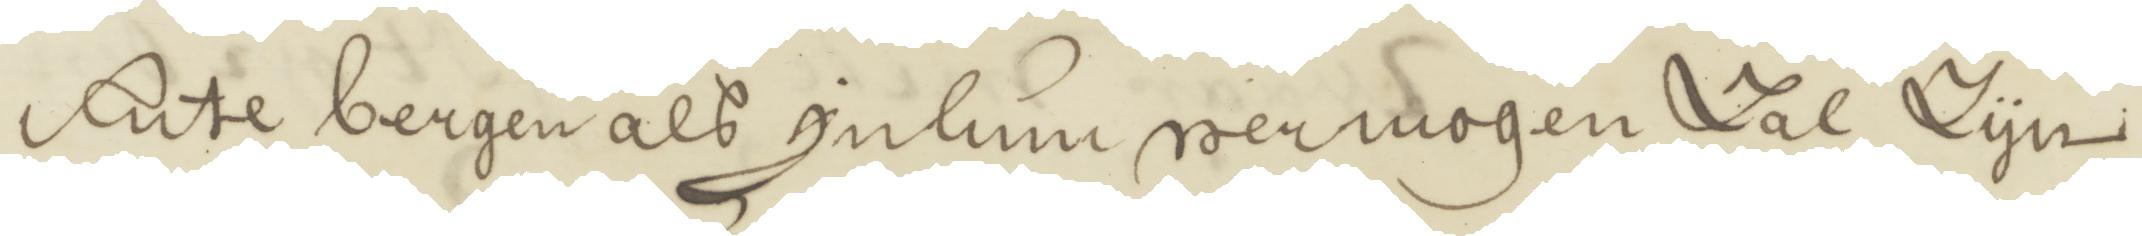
Ente bergen als jn hun vermogen zal, zijn
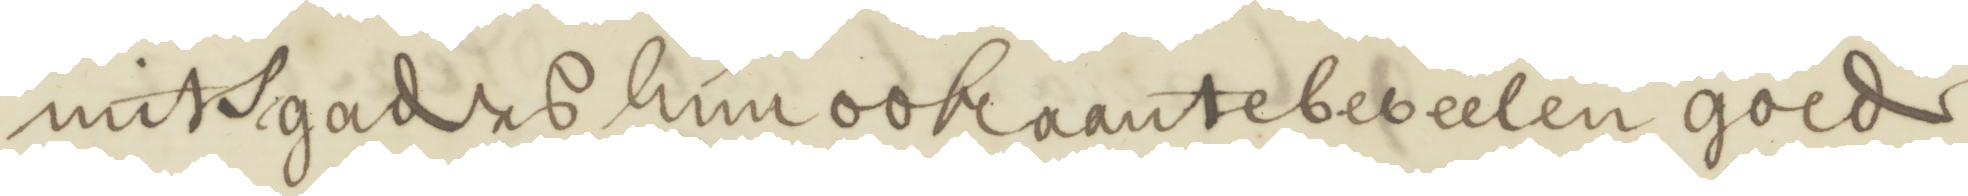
mitsgaders hun ook aantebeveelen goede
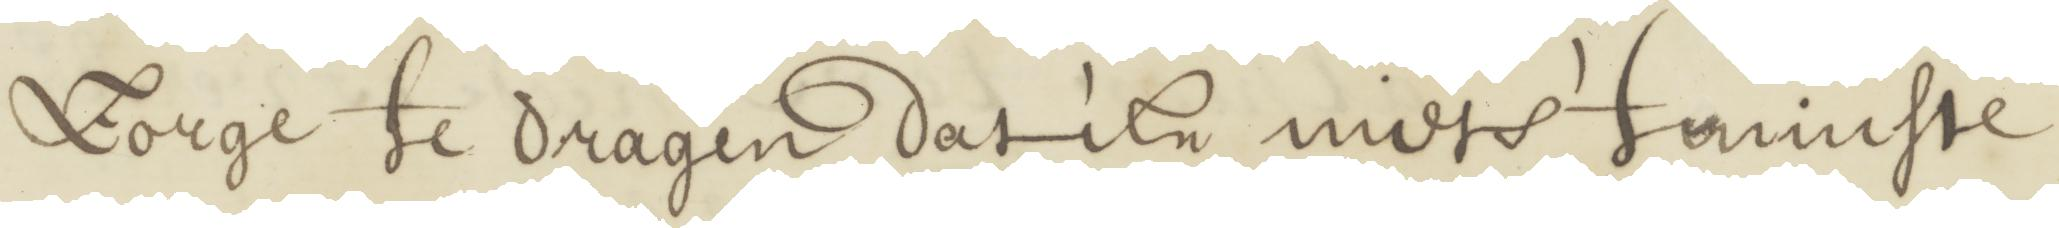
zorge te dragen dat 'Er niets 't minste
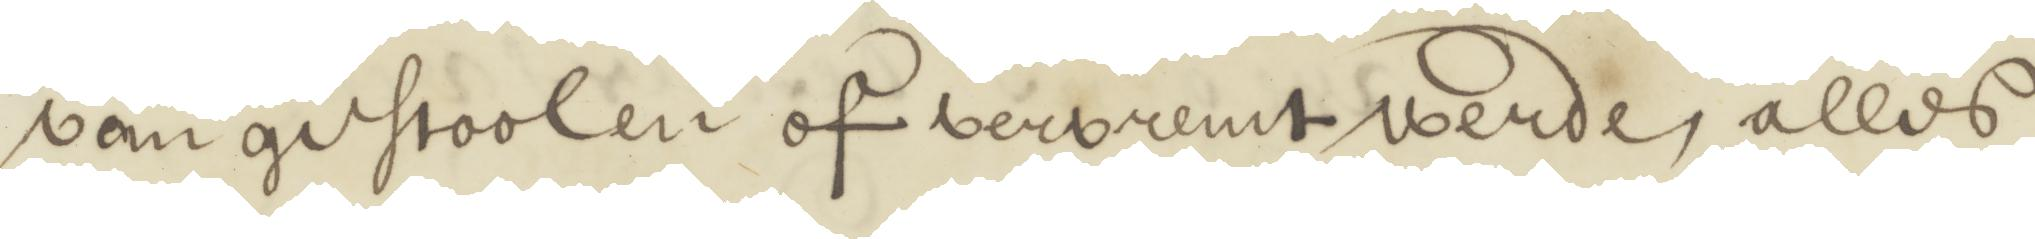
van gestoolen of vervremt werde, alles
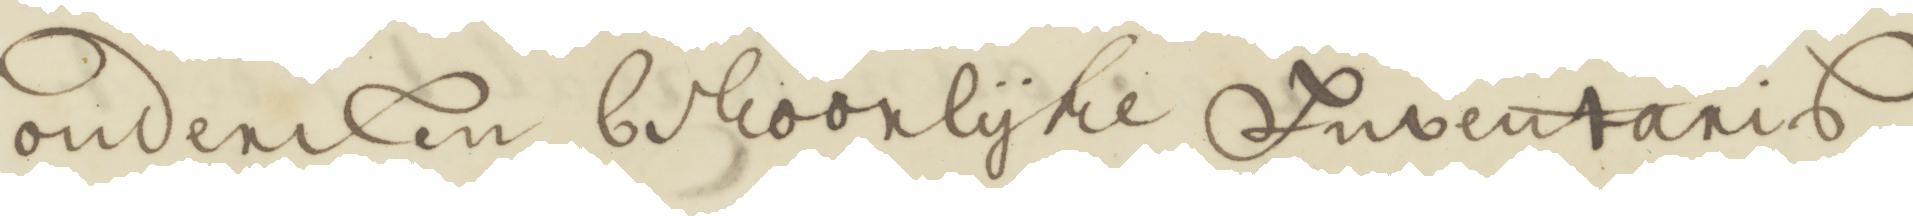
onder Een behoorlijke Jnventaris
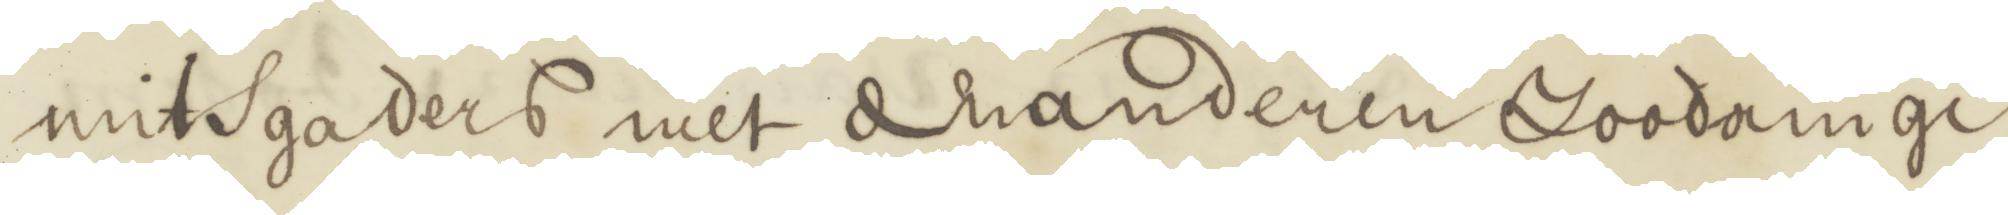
mitsgaders met den anderen zoodanige
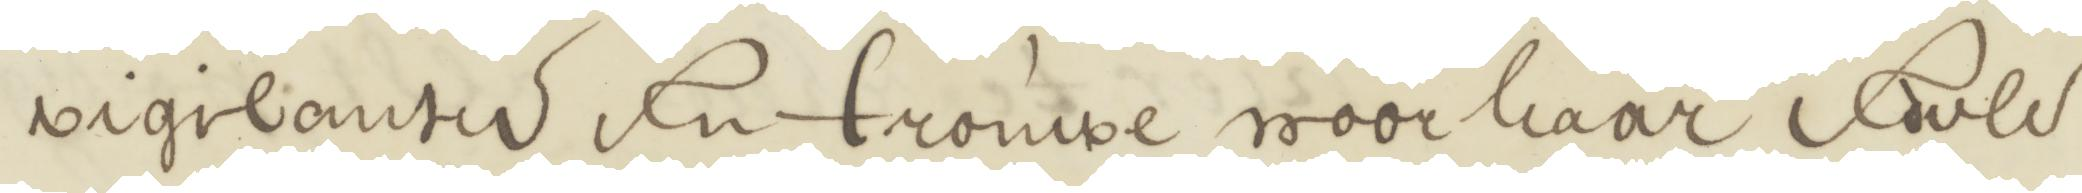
vigilantie En trouwe voor haar Edele
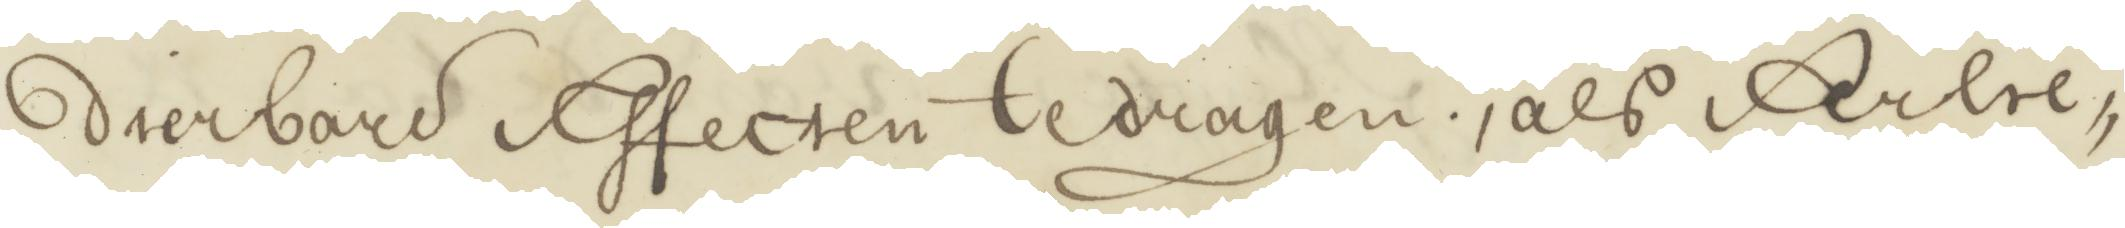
dierbare Effecten te dragen., als Eerlie„
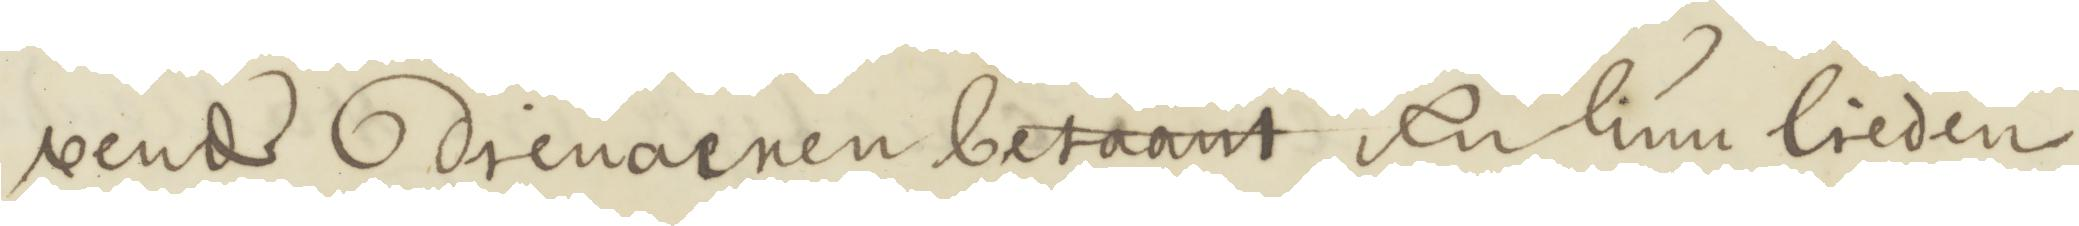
vende dienaeren betaant, En hun lieden
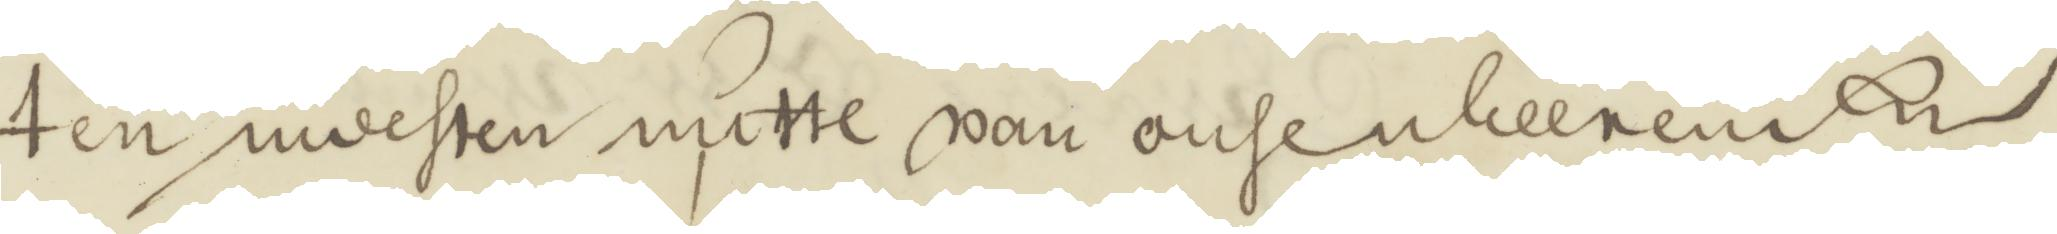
ten meesten nutte van onsen heeren En
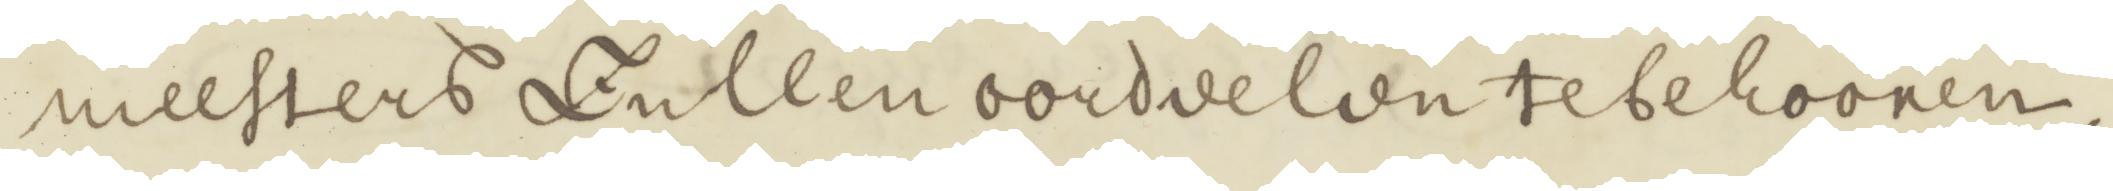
meesters zullen oordeelen te behooren,
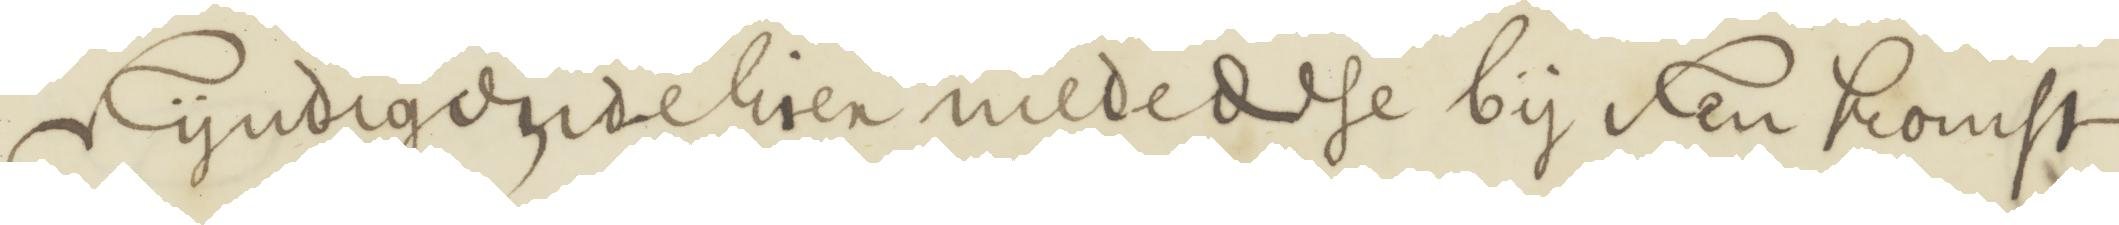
Eijndigende hier mede dese bij Een komst
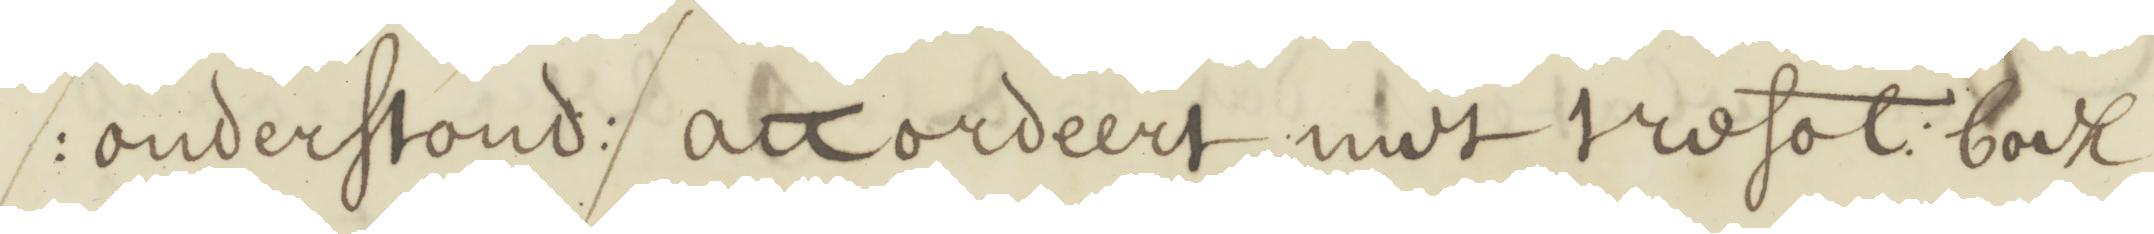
/:onderstond:/ accordeert met 1 resol: boek
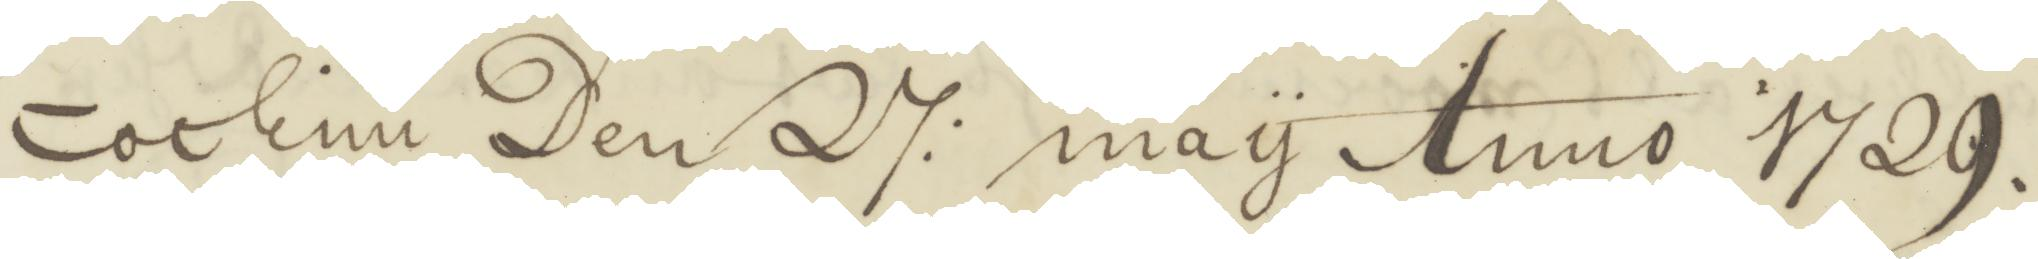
Cochim Den 27: maij Anno 1729.
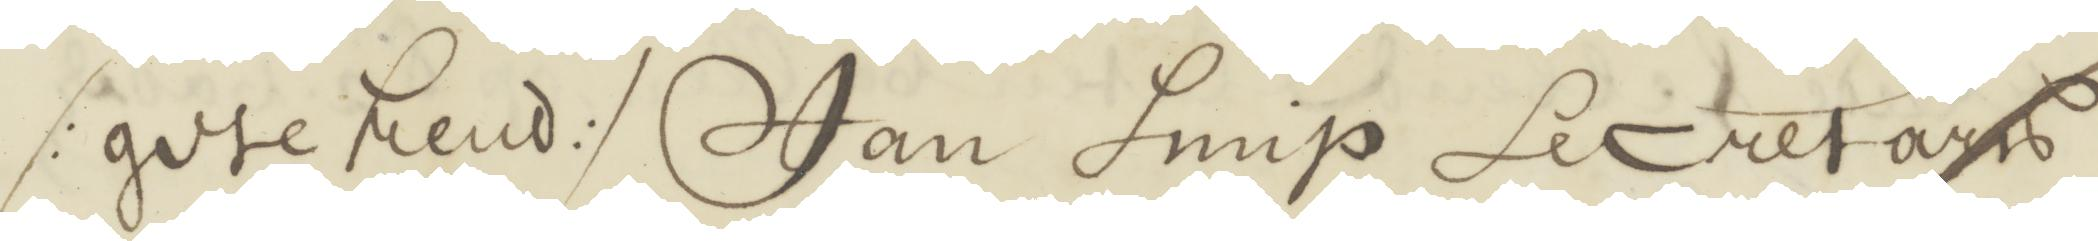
/: getekend :/ Jan Smip Secretaris
